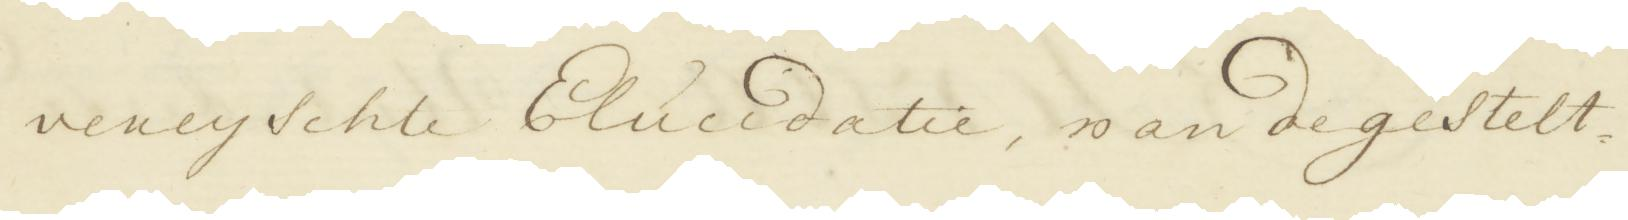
vereyschte Elucidatie, van de gestelt„
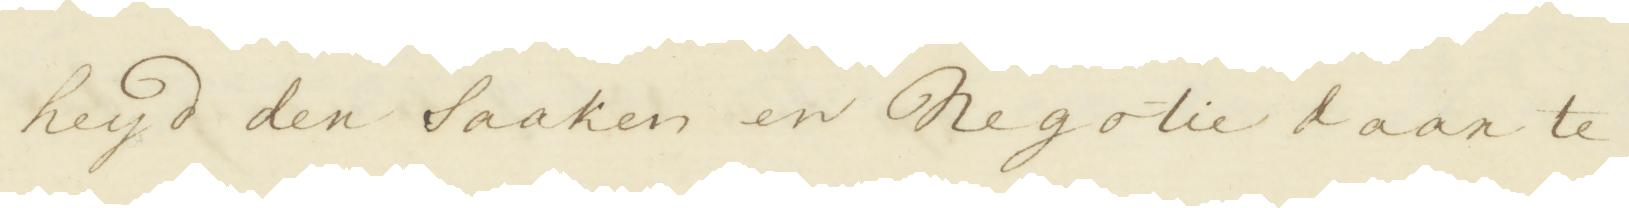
heijd der saaken en Negotie daar te
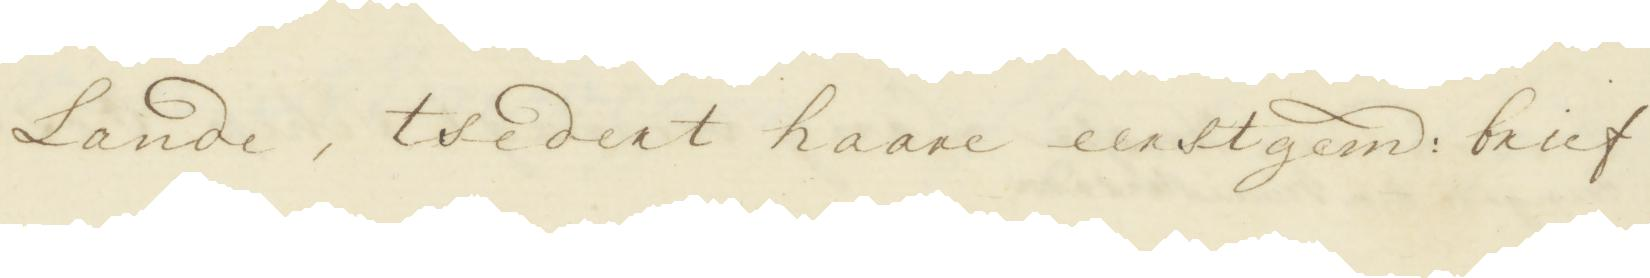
Lande, tsedert haare eerst gem: brief
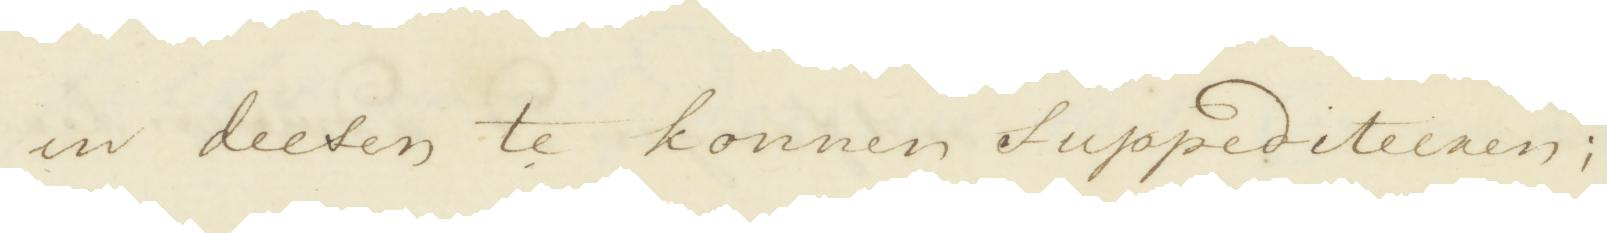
in deesen te konnen suppediteeren;
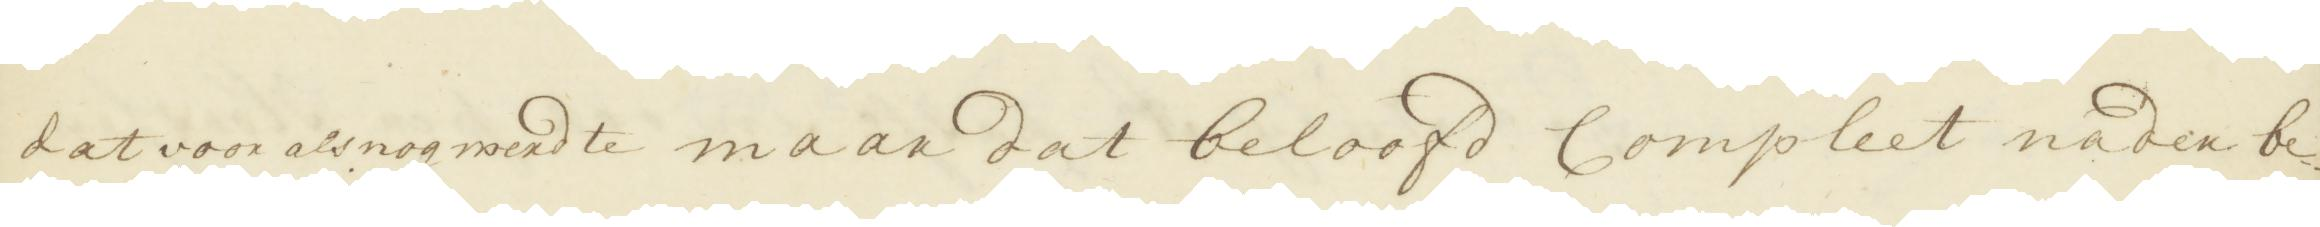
dat voor als nog werd te maar dat beloofd Compleet nader be„
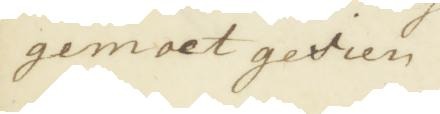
gemoet gesien
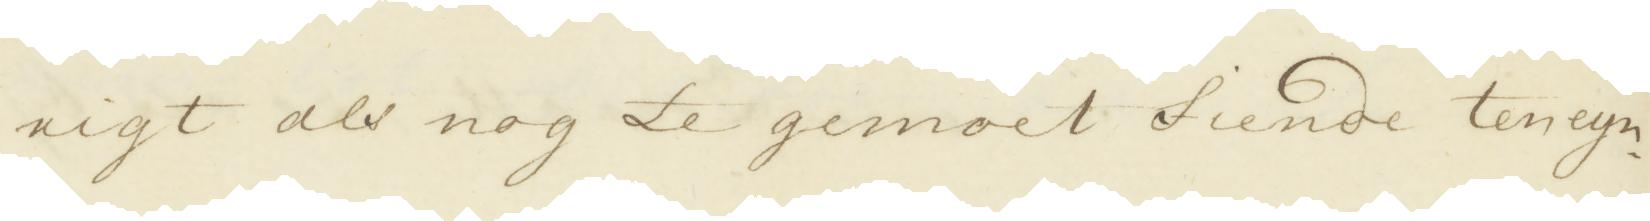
rigt als nog te gemoet siende ten eyn
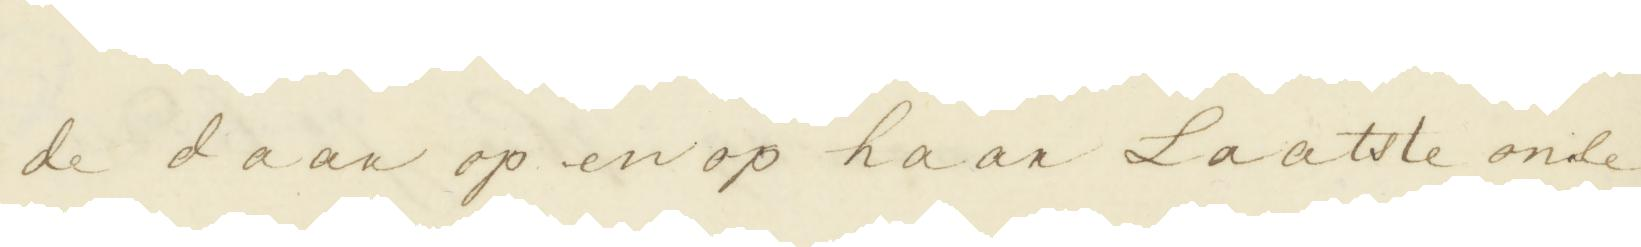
de daar op en op haar Laatste onse
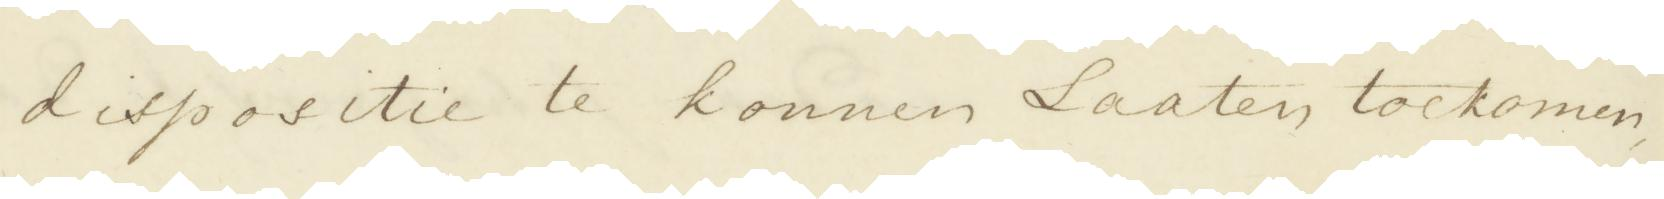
dispositie te konnen Laaten toekomen
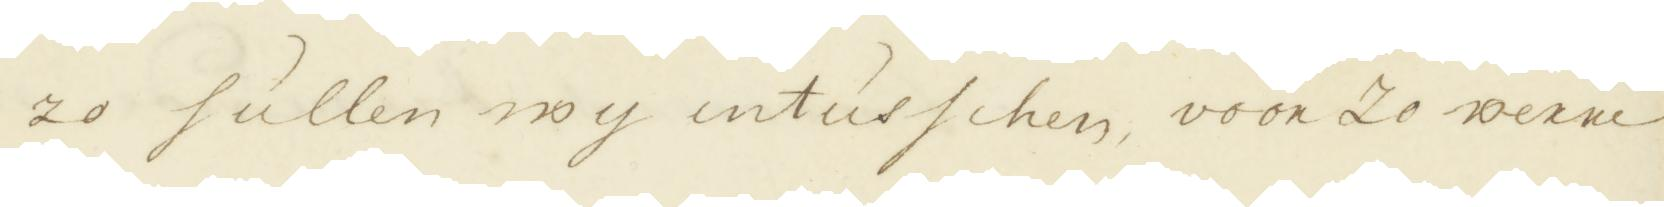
zo sullen wy intusschen, voor zo verre
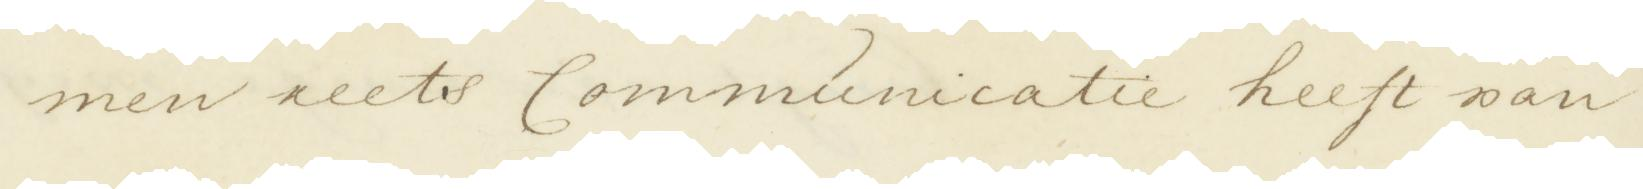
men reets Communicatie heeft van
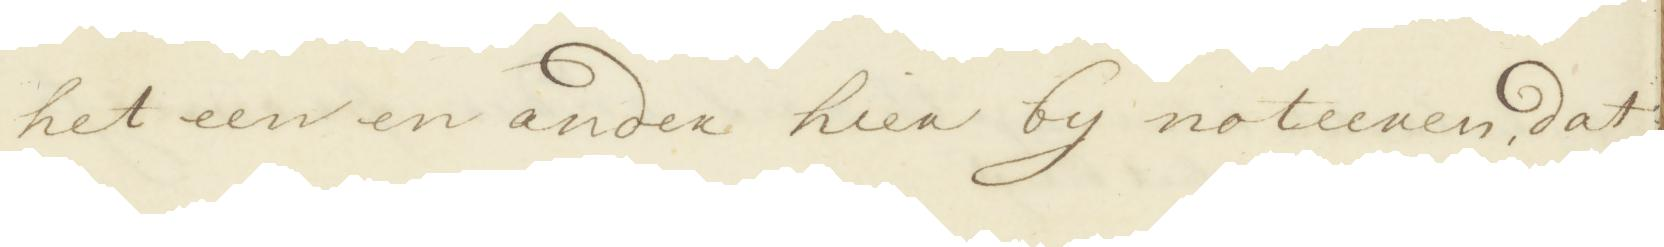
het een en ander hier by noteeren, dat
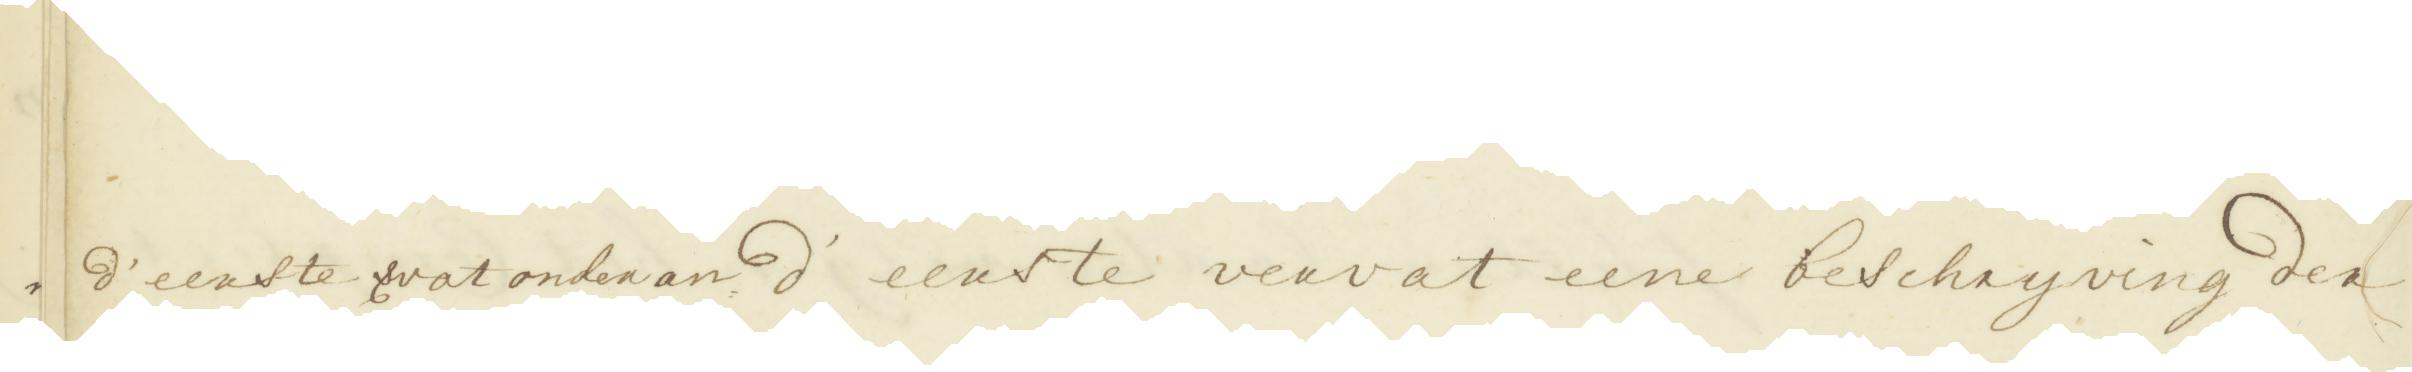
d’ eerste vervat onder an: d’ eerste vervat eene beschryving der
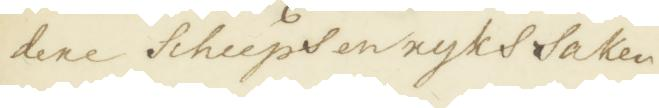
dere scheeps en ryks saken
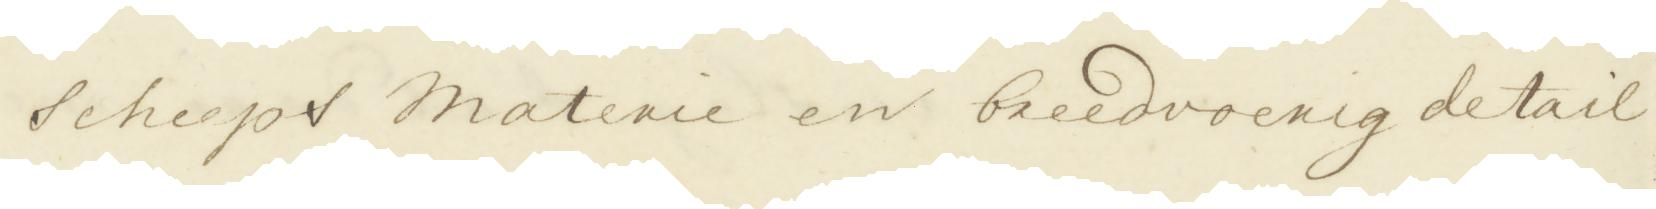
scheeps materie en breedvoerig detail
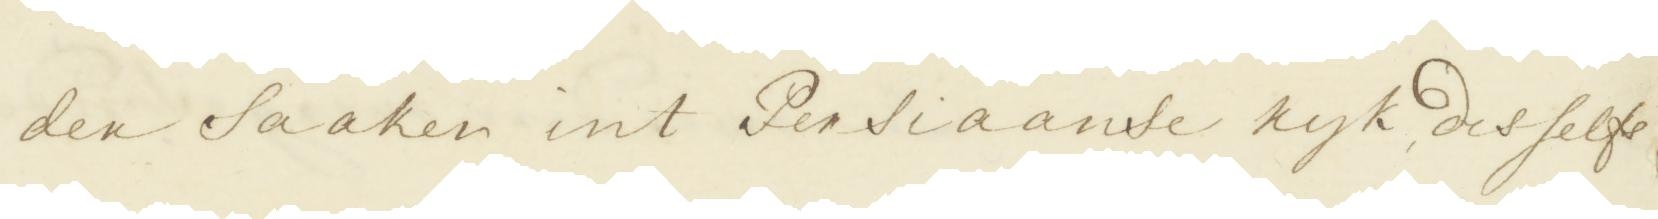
der saaken int Persiaanse ryk, desselfs
